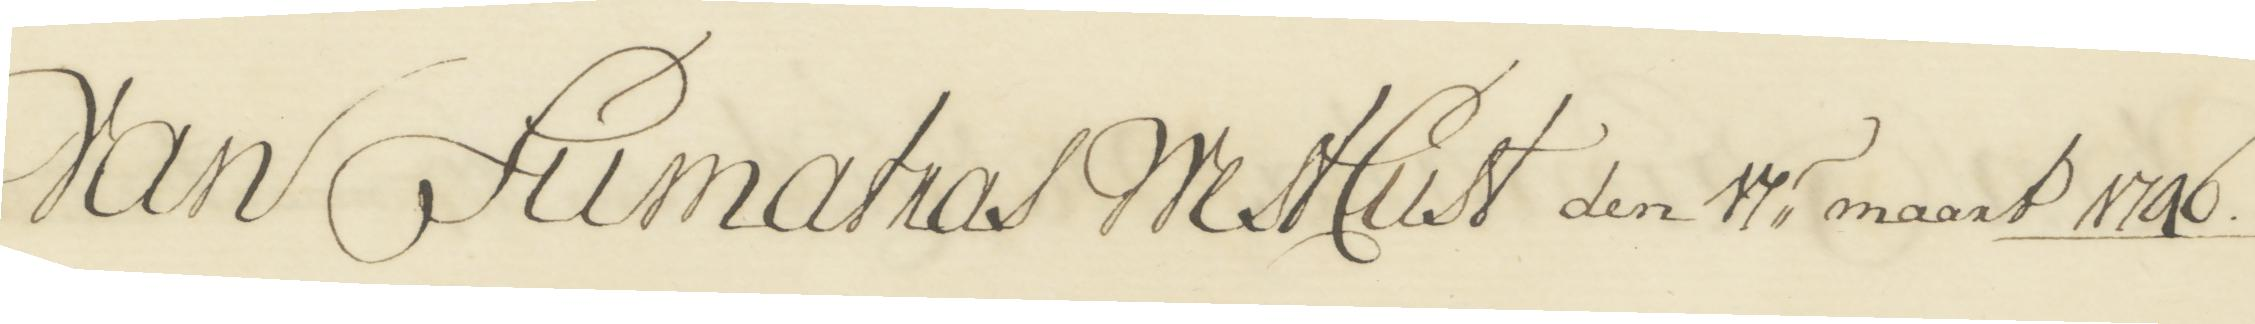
Van Sumatras West Cust den 17„' maart 1746.
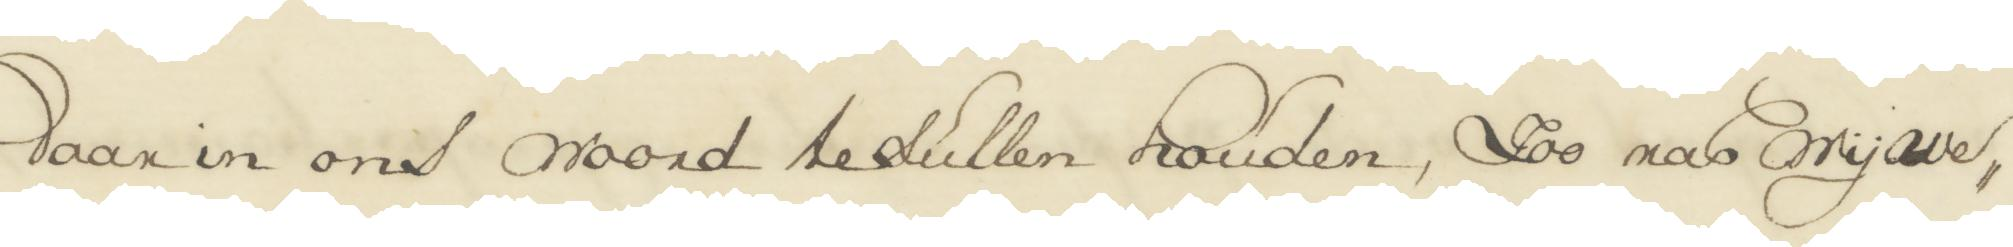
daar in ons woord tesullen houden, zoo ras wij we„
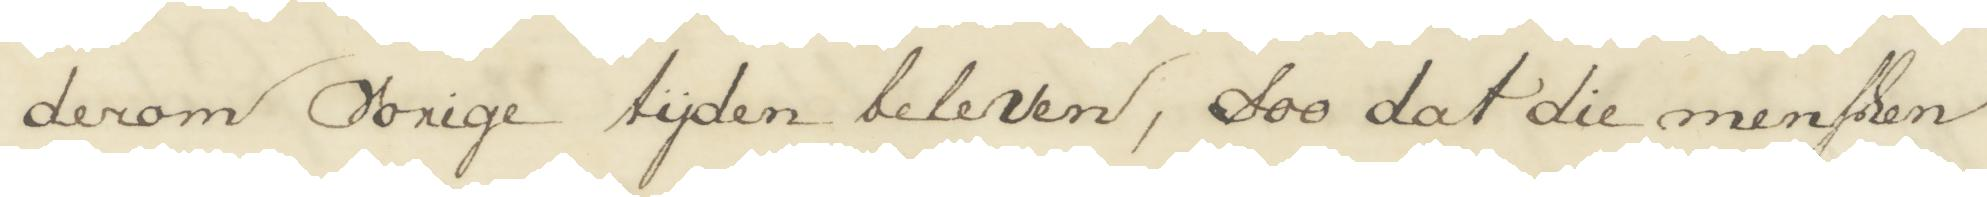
derom vorige tijden beleven, soo dat die menschen
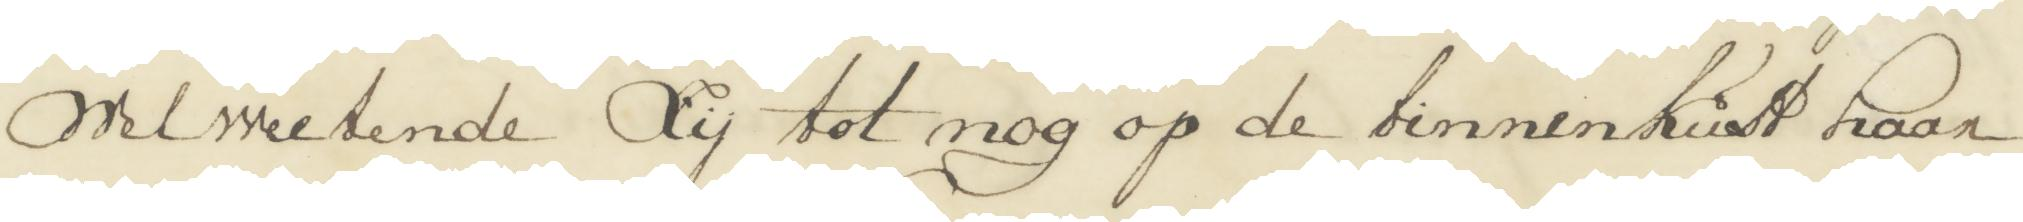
wel weetende zij tot nog op de binnenkust haar
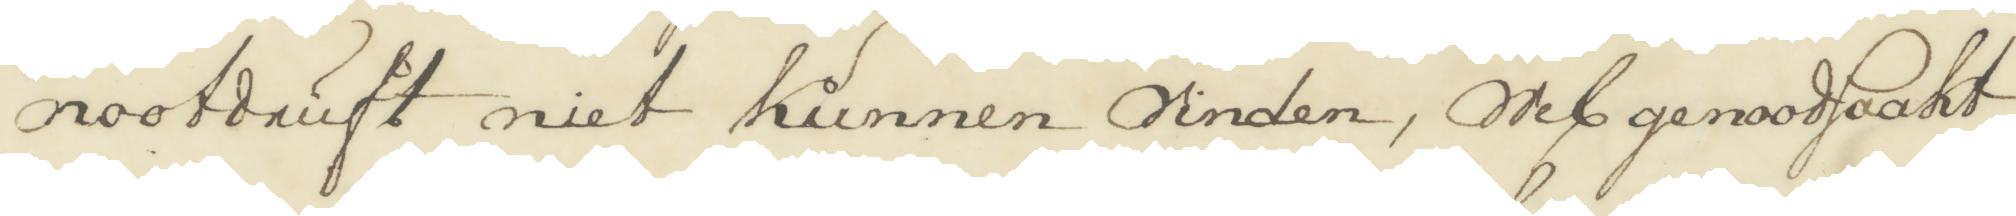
nootdruft niet kunnen vinden, wel genoodsaakt
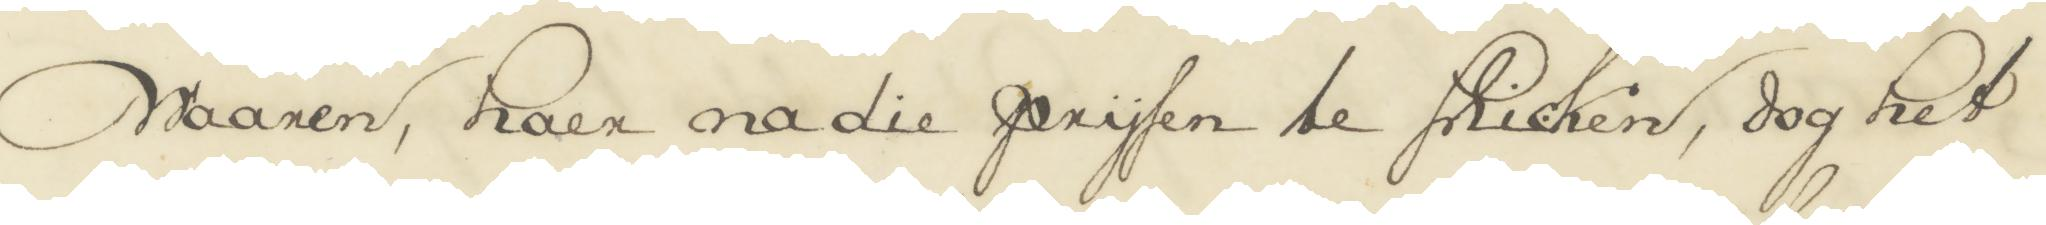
waaren, haer na die prijsen te schicken, dog het
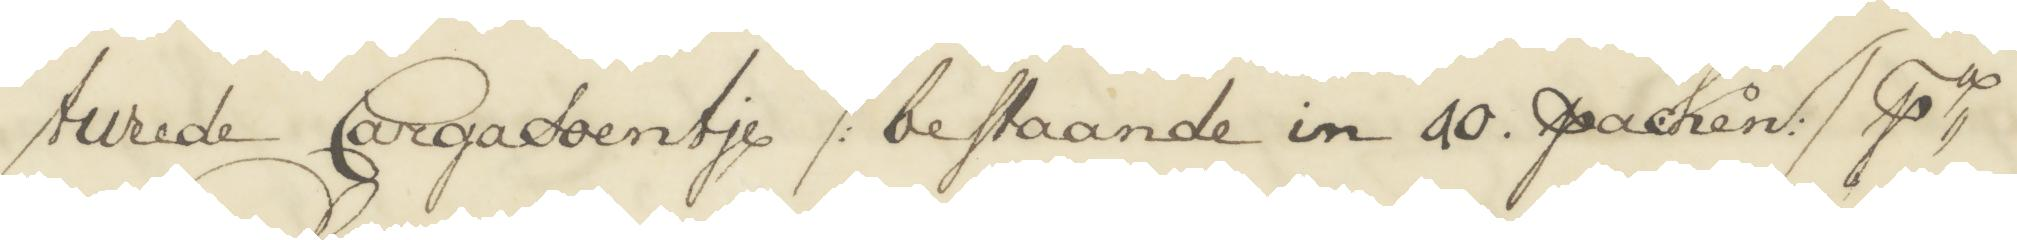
tweede Cargasoentje /: bestaande in 40. packen:/ p„r
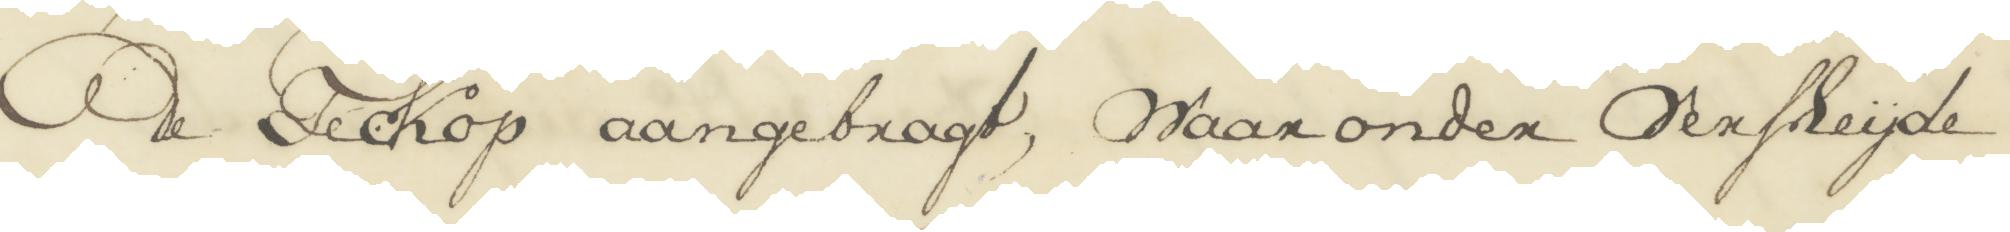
de Teckop aangebragt, waar onder verscheijde
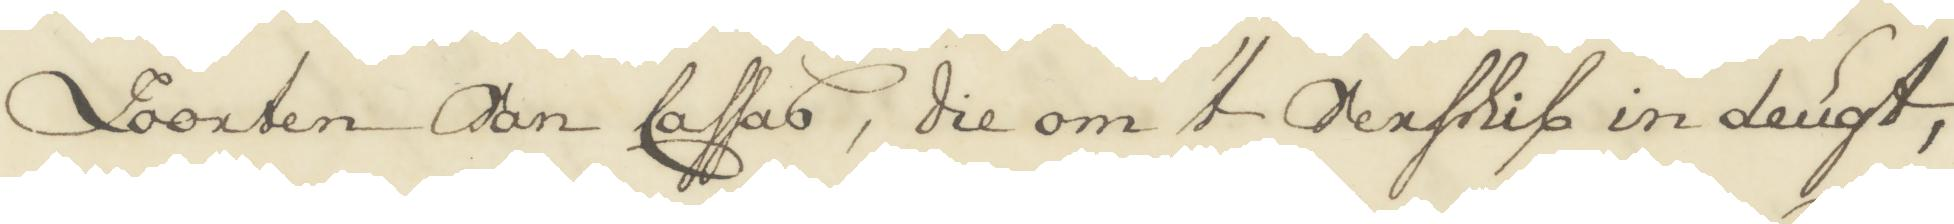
zoorten van Cassas, die om ’t verschil in deugt,
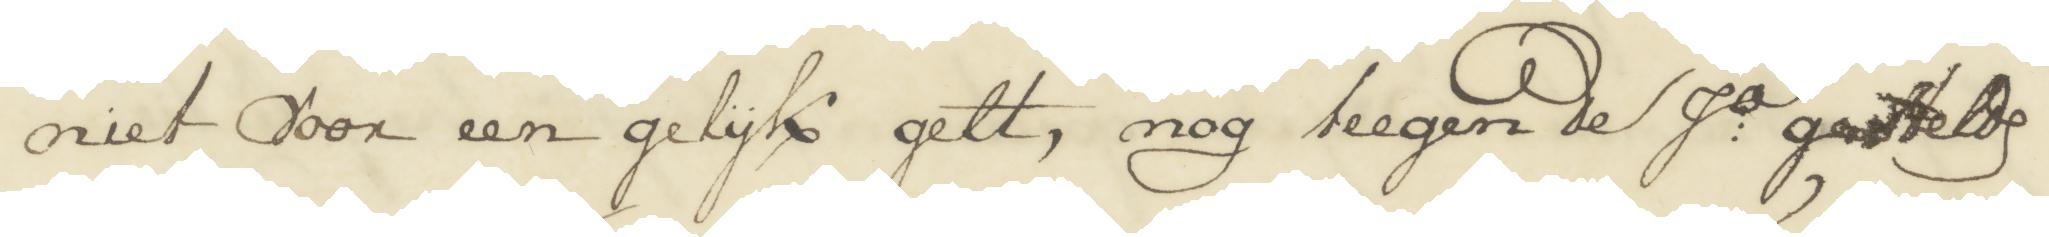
niet voor een gelijk gelt, nog teegen de J:o gestelden
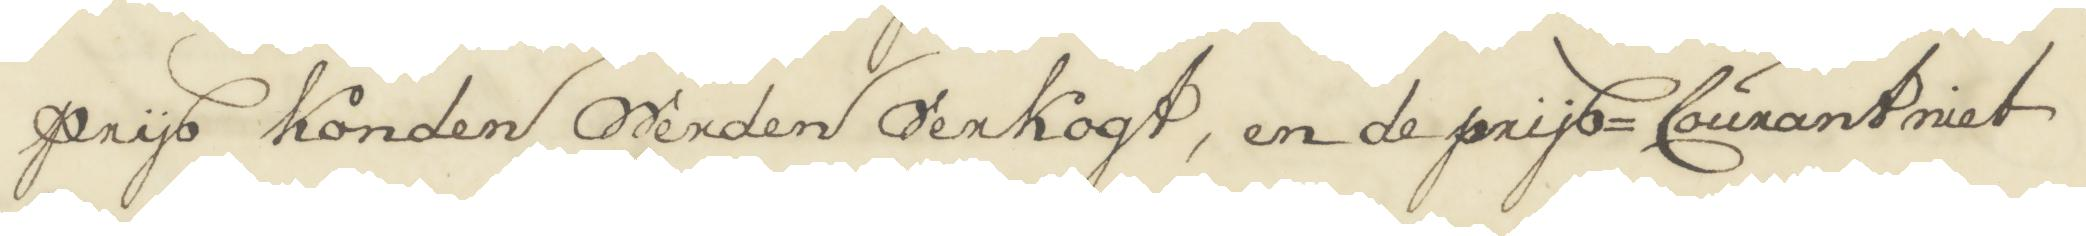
prijs konden werden verkogt, en de prijs= courant niet
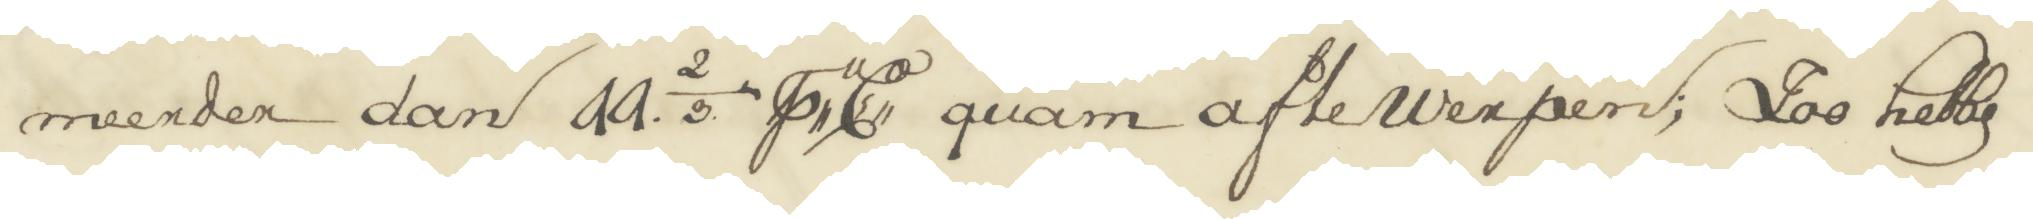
meerder dan 44. 2/3. p„r c„o quam aftewerpen; zoo hebben
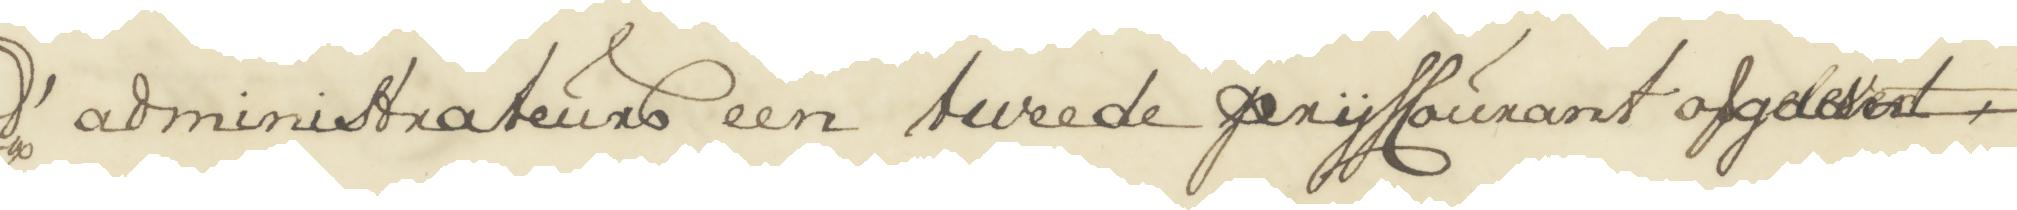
d’ administrateurs een tweede prijscourant afgelevert,
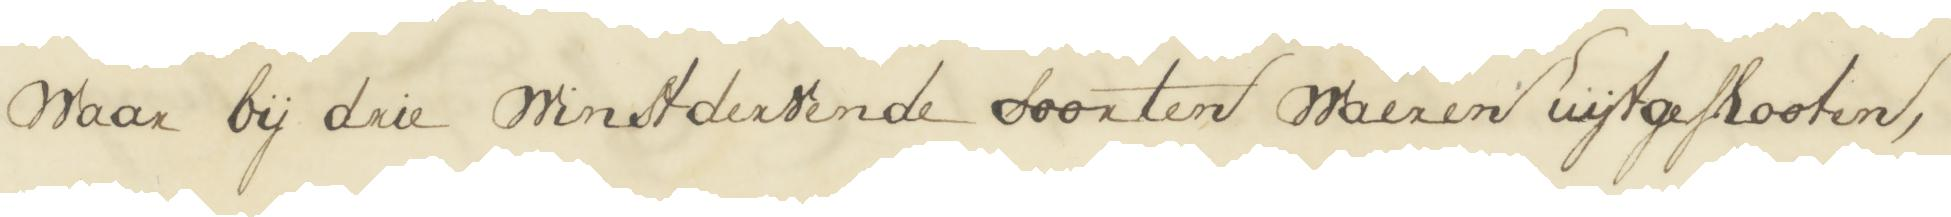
waar bij drie winstdervende soorten waeren uijtgeslooten,
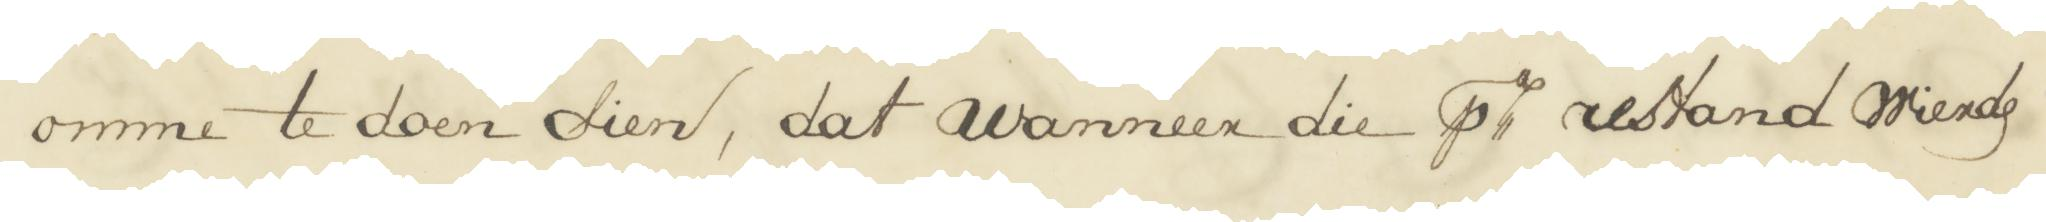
omme te doen sien, dat wanneer die p„r restand wierden
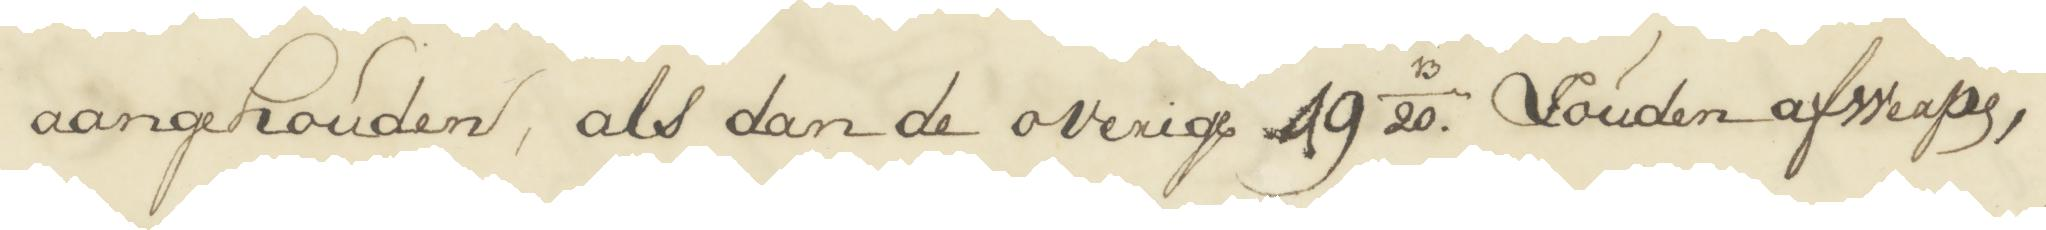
aangehouden, als dan de overige 49 13/20. zouden afwerpen,
